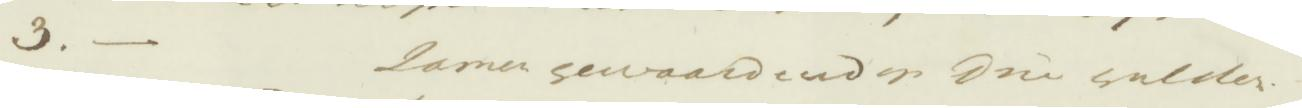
3. — zamen gewaardeerd op drie gulden.
